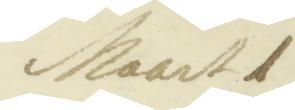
Maart 1
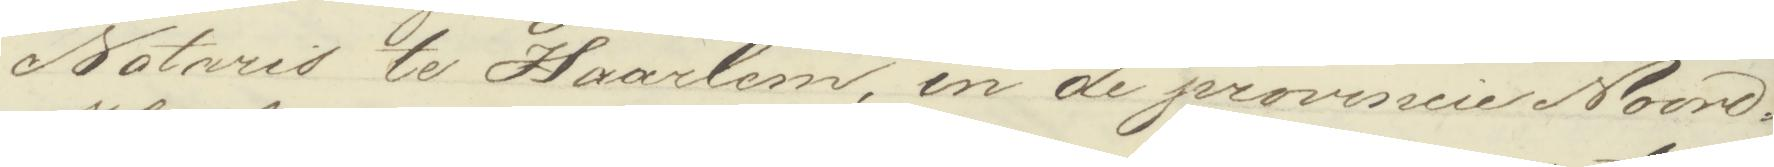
Notaris te Haarlem, in de provincie Noord
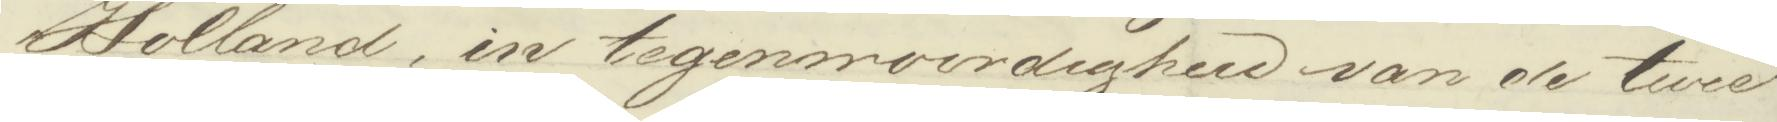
Holland, in tegenwoordigheid van de twee
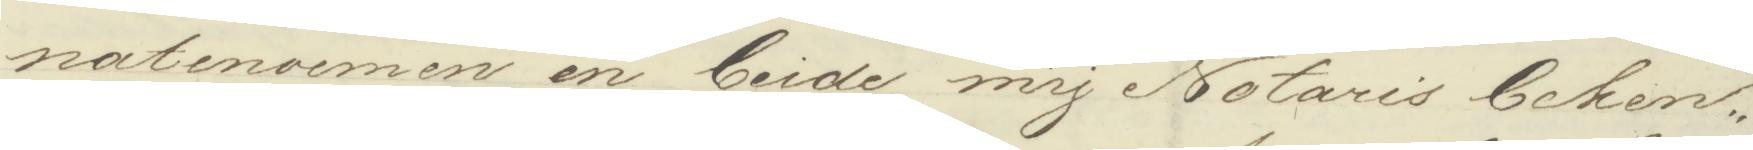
natenoemen en beide mij Notaris beken„
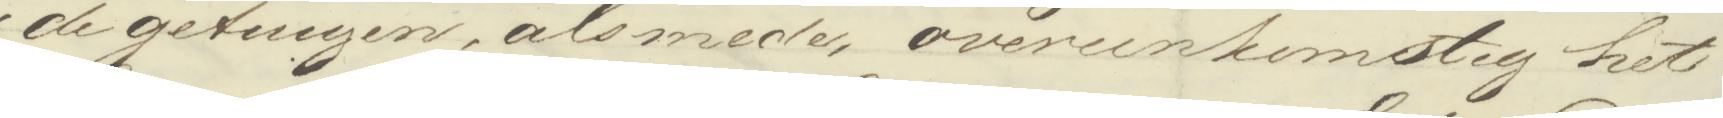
de getuigen, als mede, overeenkomstig het
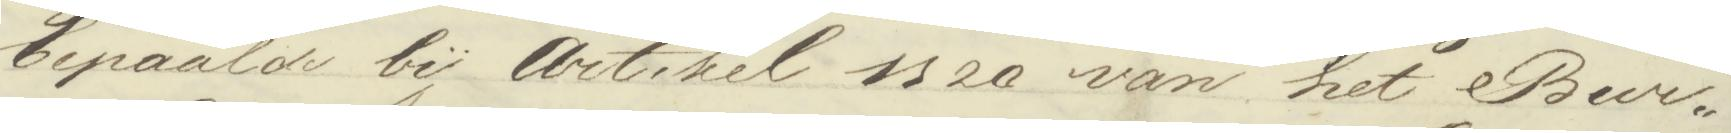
bepaalde bij Artikel 1120 van het Bur„
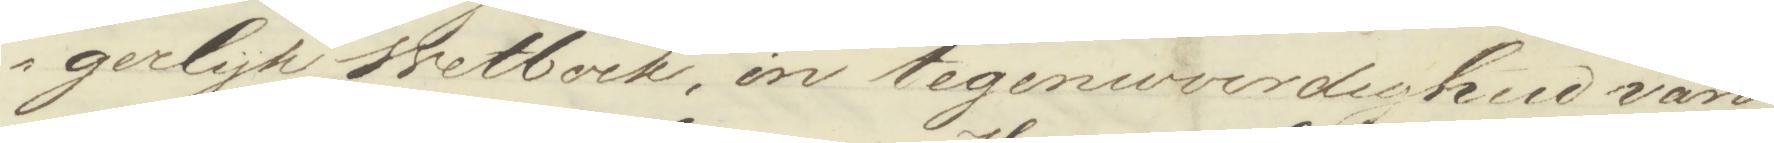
„gerlijk Wetboek, in tegenwoordigheid van
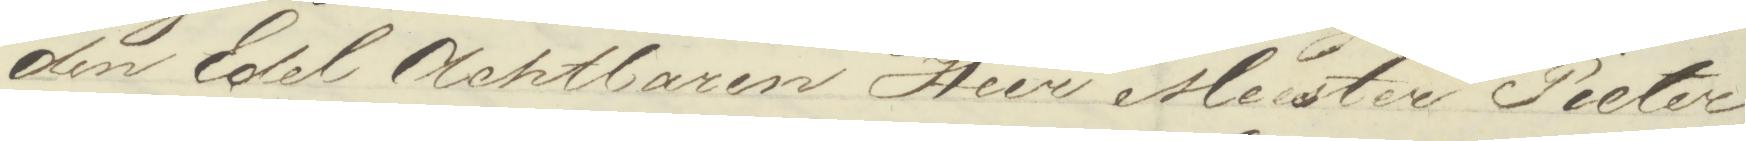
den Edel Achtbaren Heer Meester Pieter
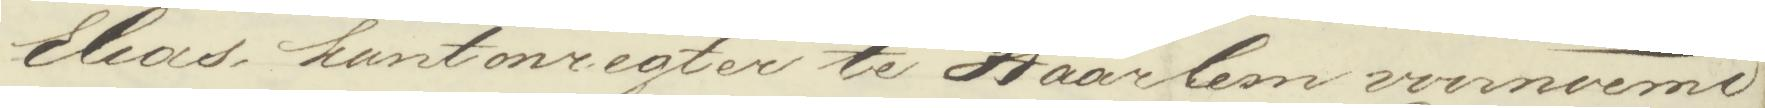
Elias, kantonregter te Haarlem voornoemd
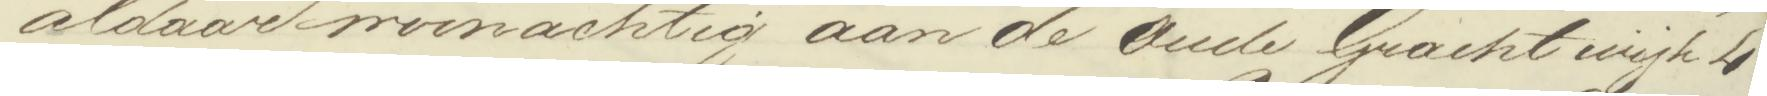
aldaar woonachtig aan de oude Gracht wijk 4
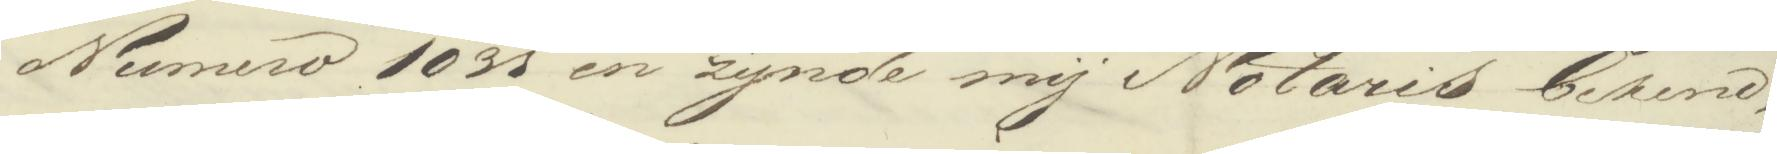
Numero 1031 en zijnde mij Notaris bekend
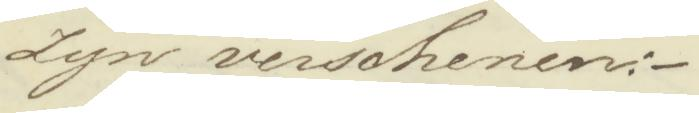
zyn verschenen:–
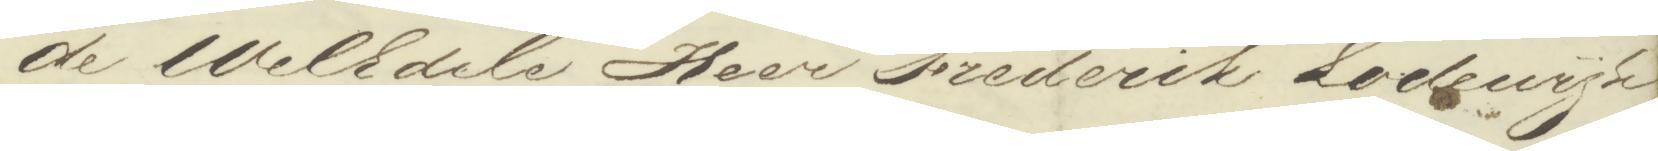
de WelEdele Heer Frederik Lodewijk
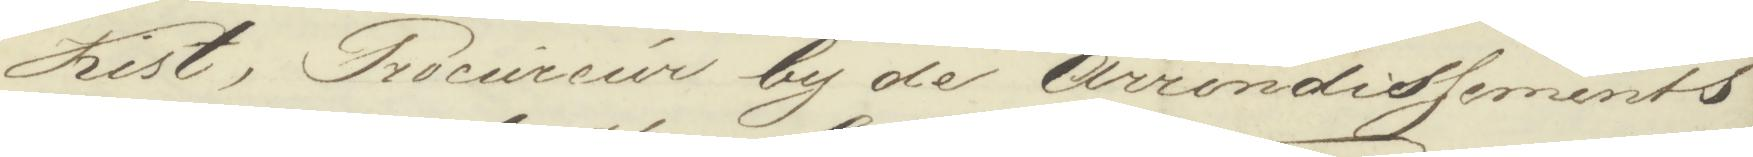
Kist, Procureur bij de Arrondissements
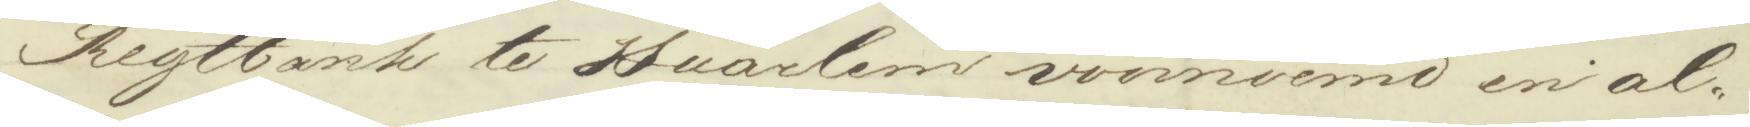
Regtbank te Haarlem voornoemd en al„
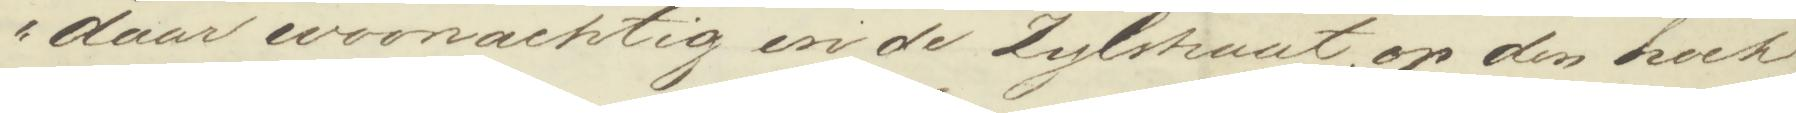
„daar woonachtig en de Zylstraat, op den hoek
